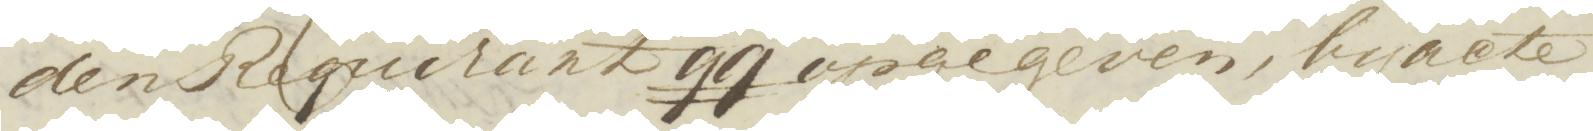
den Requirant qq opgegeven, by acte
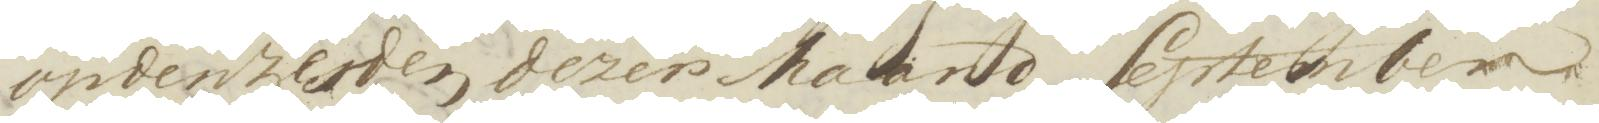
op den zesden dezer Maand September
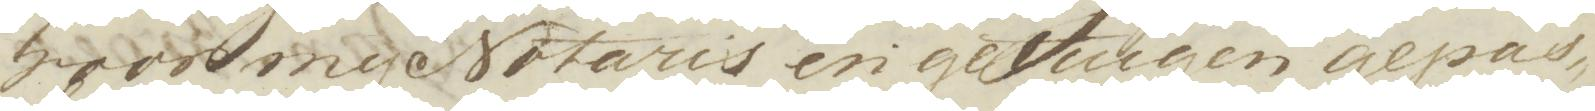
voor my Notaris en getuigen gepas„
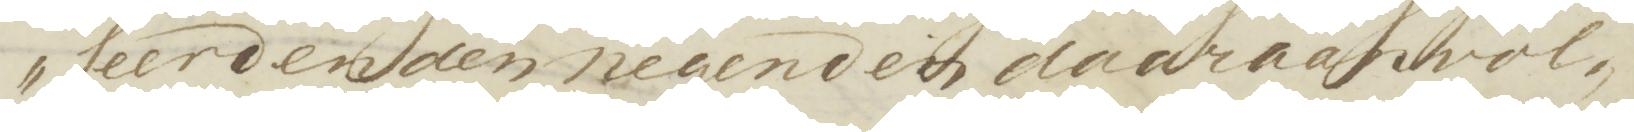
„seerd en den negenden daaraan vol„
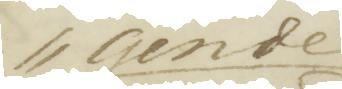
„gende
